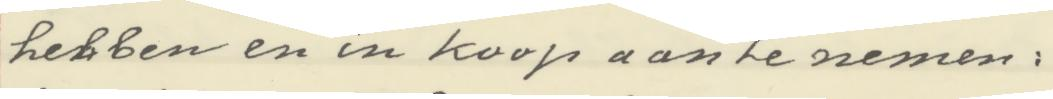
hebben en in koop aan te nemen:
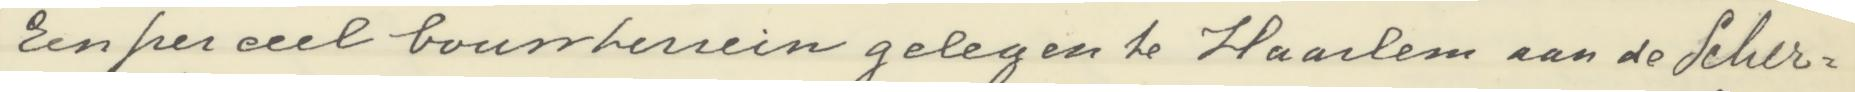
Een perceel bouwterrein gelegen te Haarlem aan de Scher=
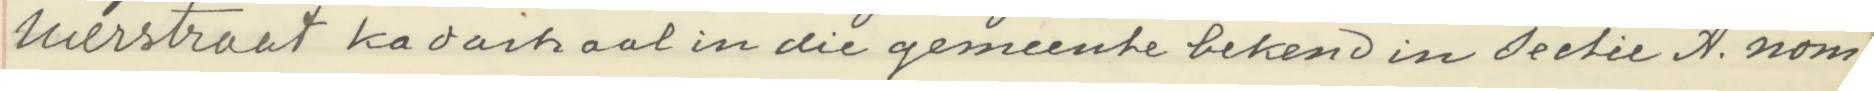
merstraat kadastraal in die gemeente bekend in sectie A. nom
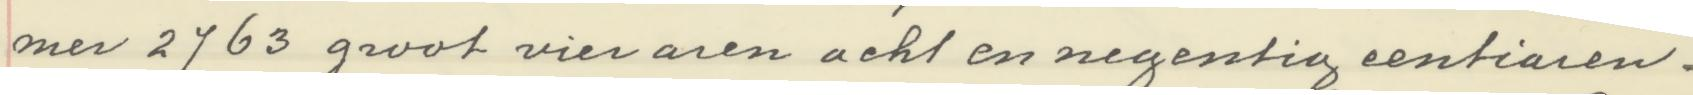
mer 2763 groot vier aren acht en negentig centiaren-
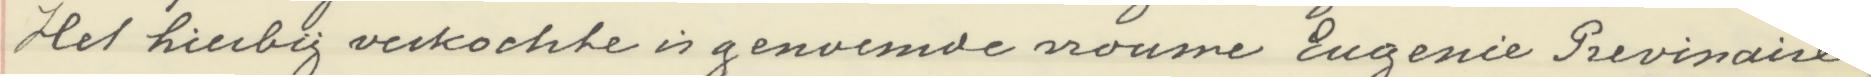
Het hierbij verkochte is genoemde vrouwe Eugenie Previnaire
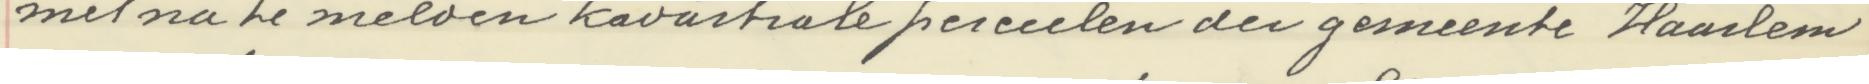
met na te melden kadastrale perceelen der gemeente Haarlem
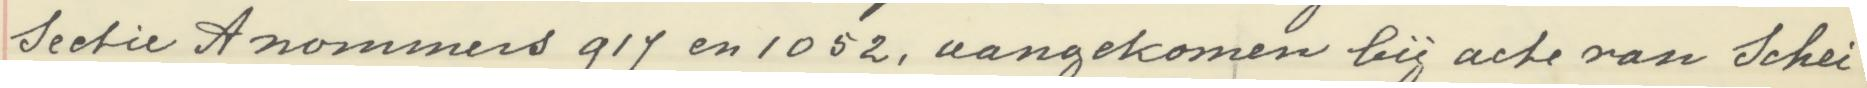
sectie A nommers 917 en 1052, aangekomen bij acte van schei
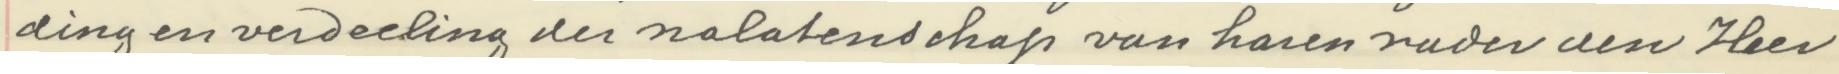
ding en verdeeling der nalatenschap van haren vader den Heer
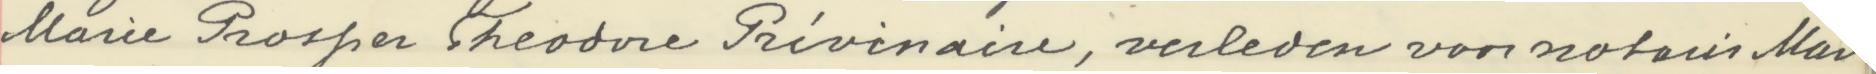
Marie Prosper Theodore Prévinaire, verleden voor notaris Mar
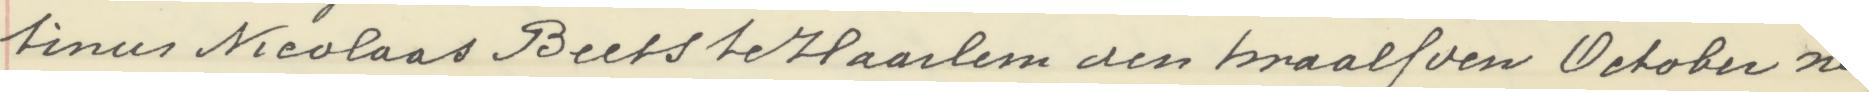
tinus Nicolaas Beets te Haarlem den twaalfden October ne
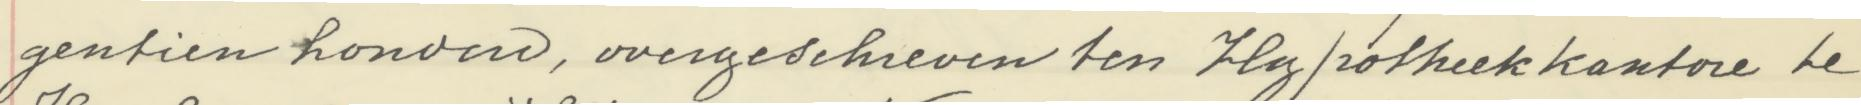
gentien honderd, overgeschreven ten Hypotheek kantore te
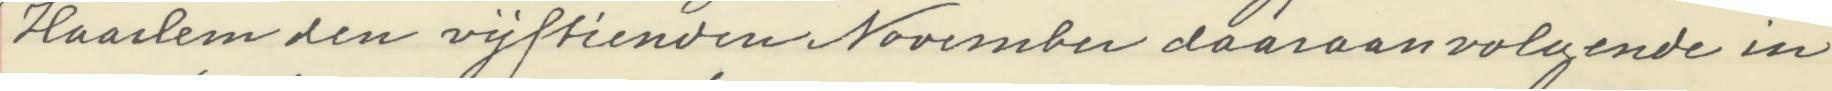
Haarlem den vijftienden November daaraan volgende in
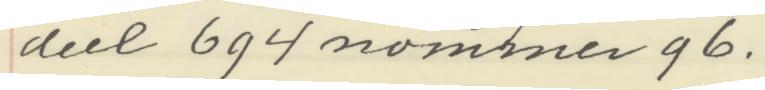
deel 694 nommer 96.
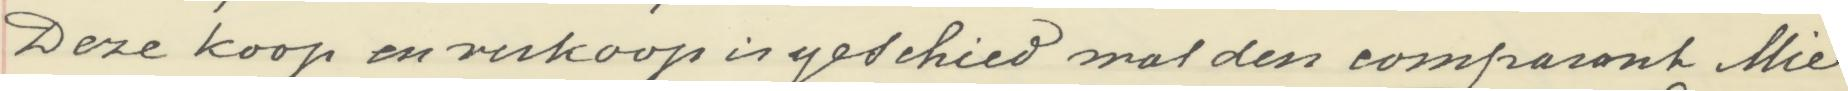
Deze koop en verkoop is geschied wat den comparant Mie
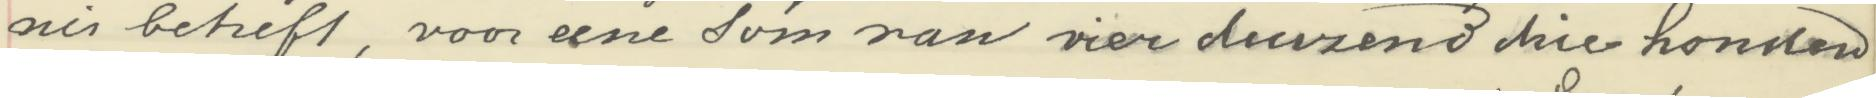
nis betreft, voor eene som van vier duizend drie honderd
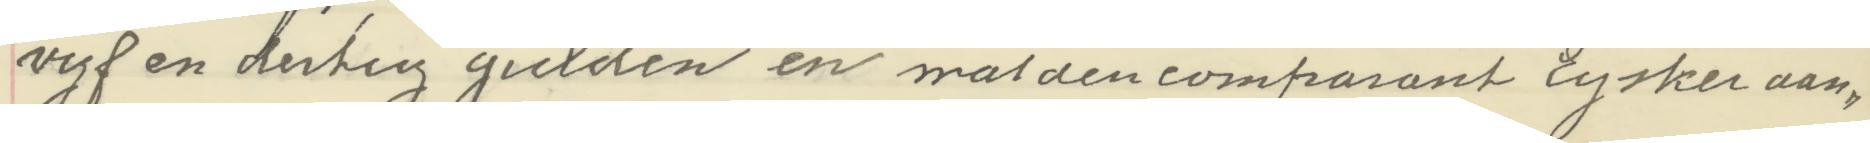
vyf en dertig gulden en wat den comparant Eysker aan„
